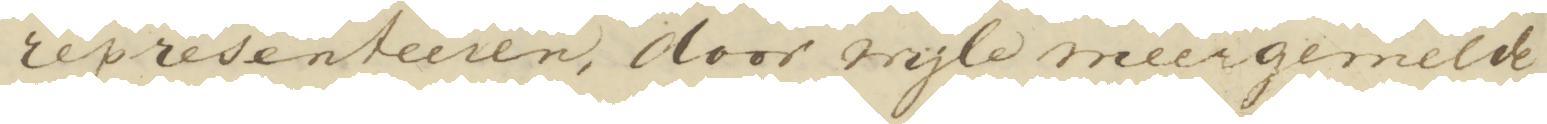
representeeren, door wijle meer gemelde
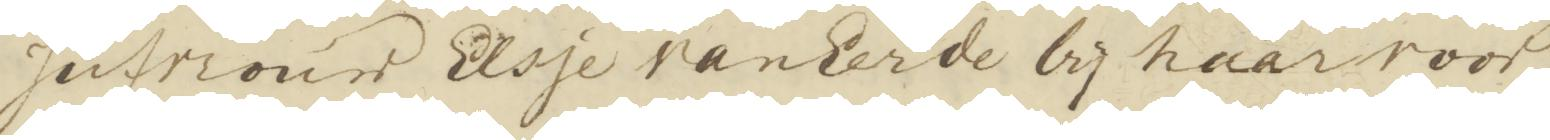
Jufvrouw Elsje van Eerde bij haar voor
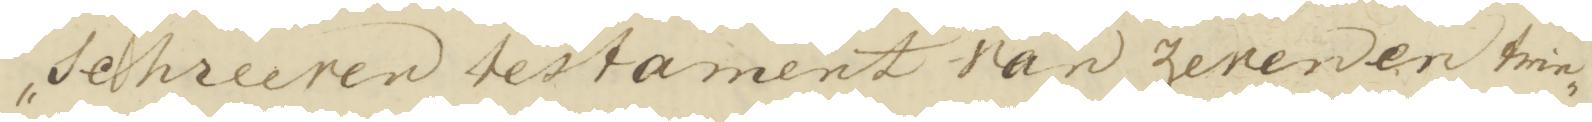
„schreeven testament van zeven en twin„
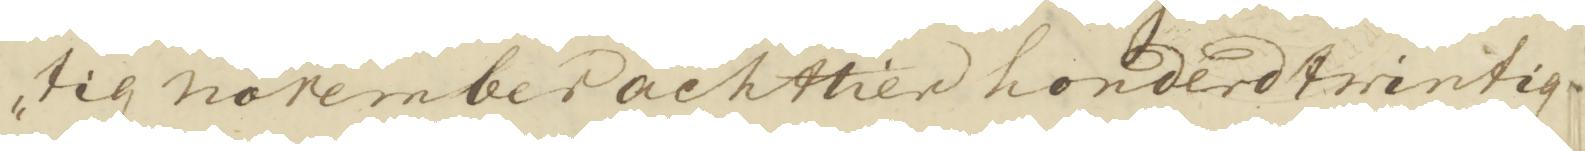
„tig november achttien honderd twintig
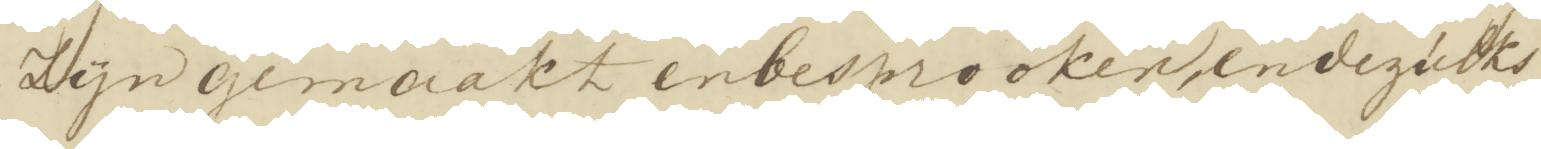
zijn gemaakt en besprooken, en de zulks
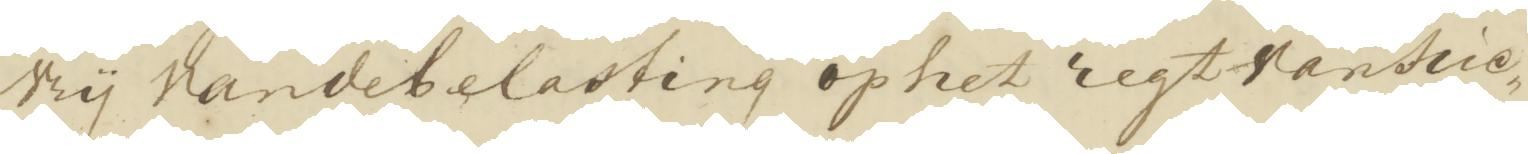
vrij van de belasting op het regt van suc„
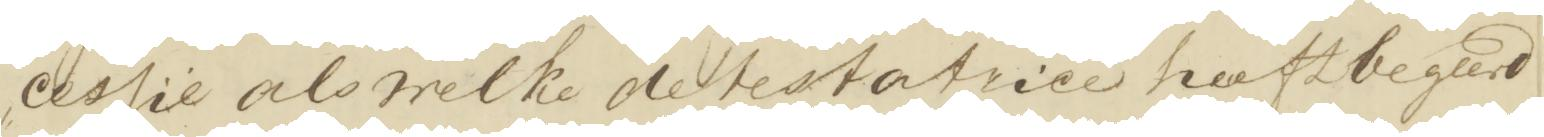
„cessie als welke de testatrice heeft begeerd
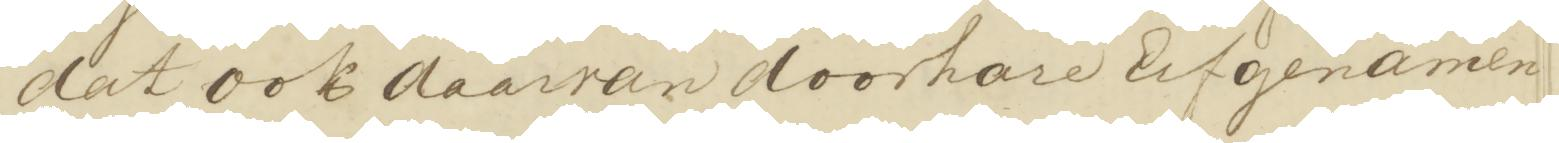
dat ook daarvan door hare Erfgenamen
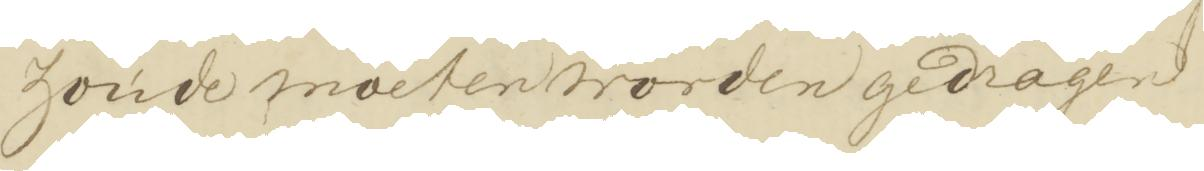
zoude moeten worden gedragen
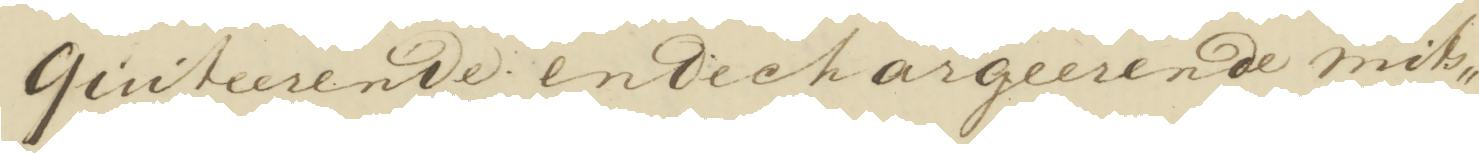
Quiteerende en dechargeerende mits„
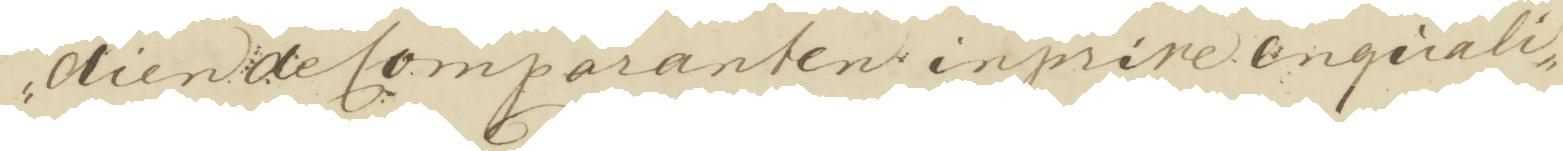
„dien de comparanten in prive en quali„
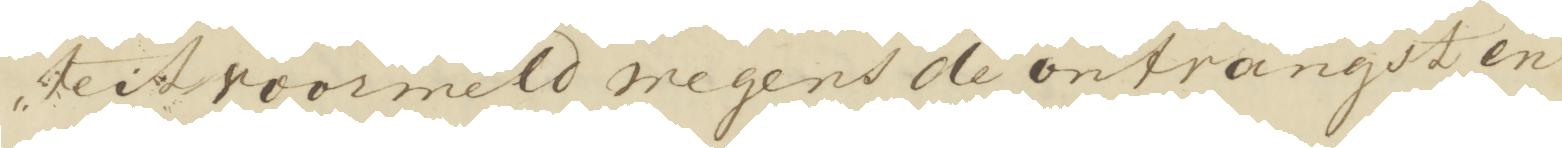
„teit voormeld wegens de ontvangst en
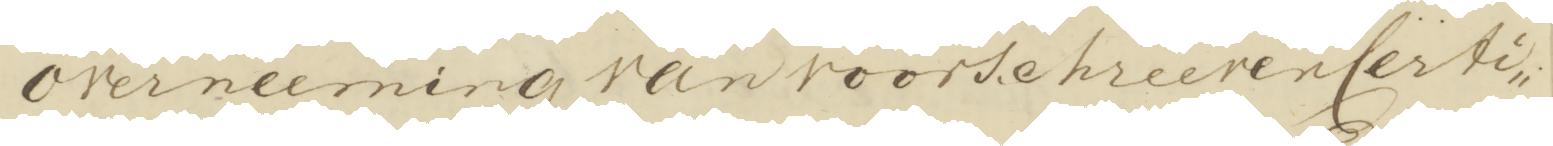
overneeming van voorschreeven certi„
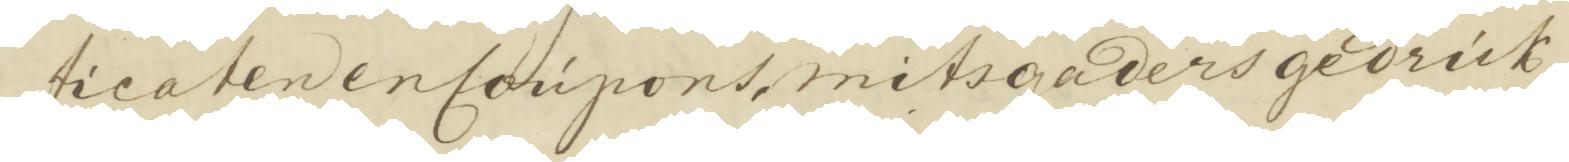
ficaten en coupons, mitsgaders gedruk
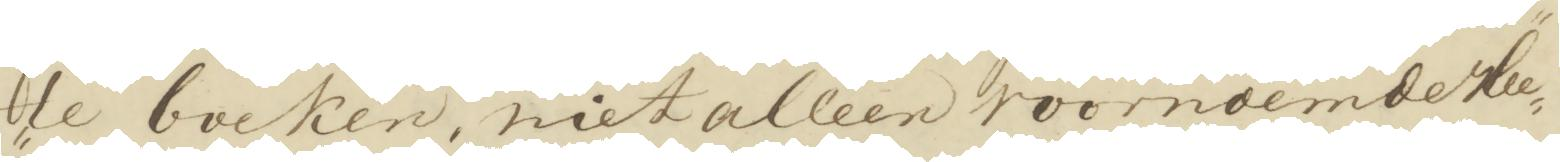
„te boeken, niet alleen voornoemde Hee„
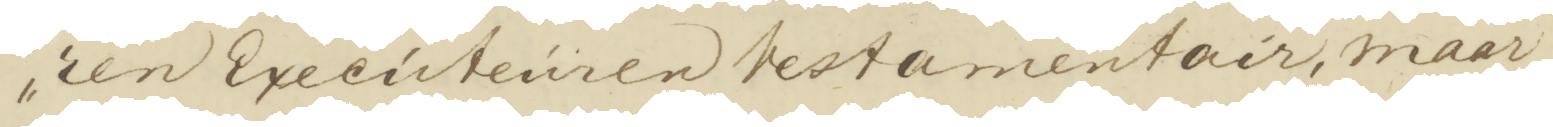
„ren Executeuren testamentair, maar
